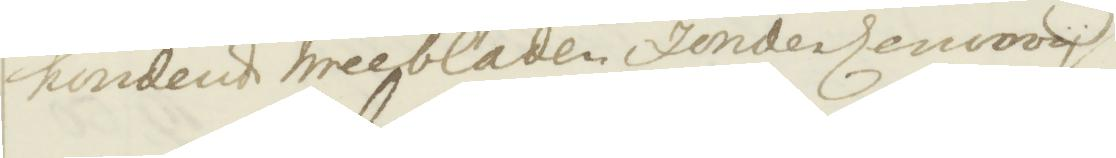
honderd twee bladen, zonder Renvooij
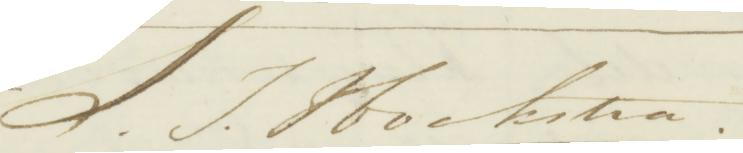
J. J: Hoekstra.
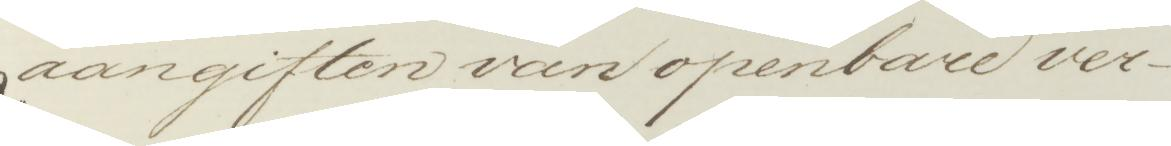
aangiften van openbare ver-
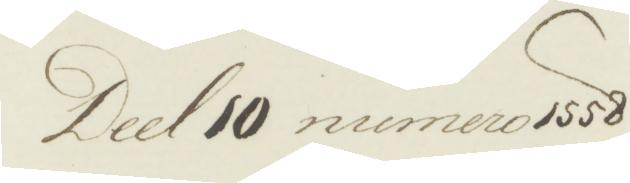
Deel 10 numero 1558
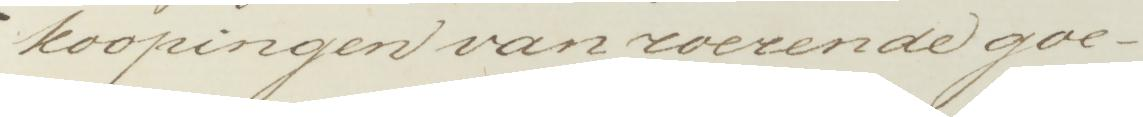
koopingen van roerende goe-
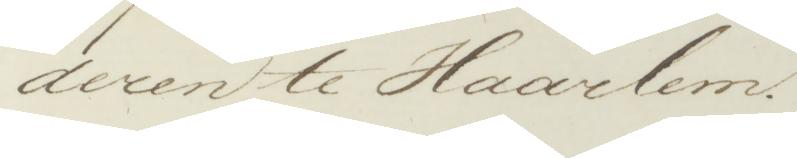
deren te Haarlem.
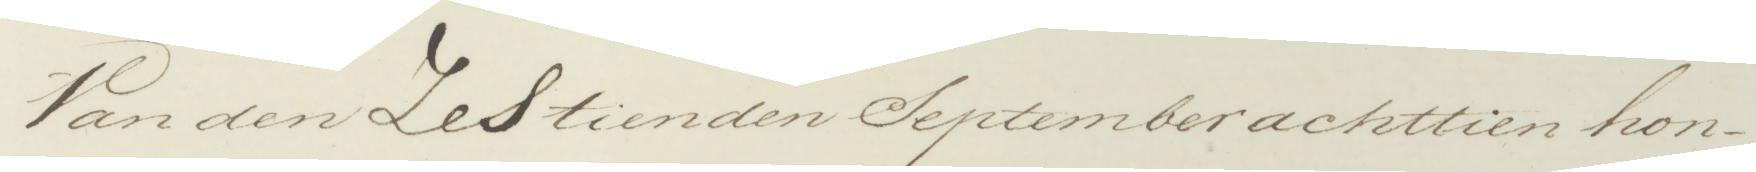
Van den Zestienden September achttien hon-
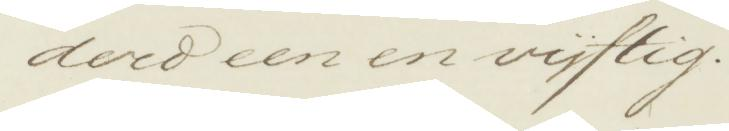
derd een en vijftig.
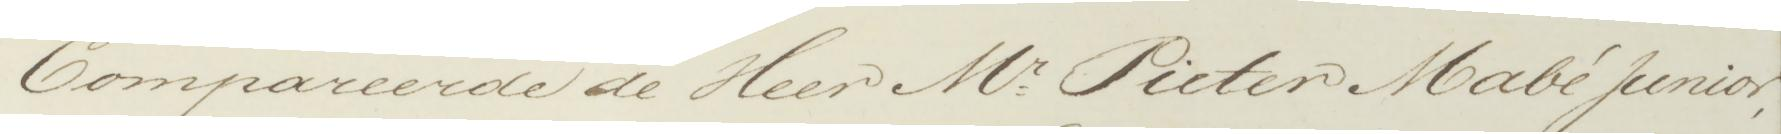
Compareerde de Heer M:r Pieter Mabé Junior,
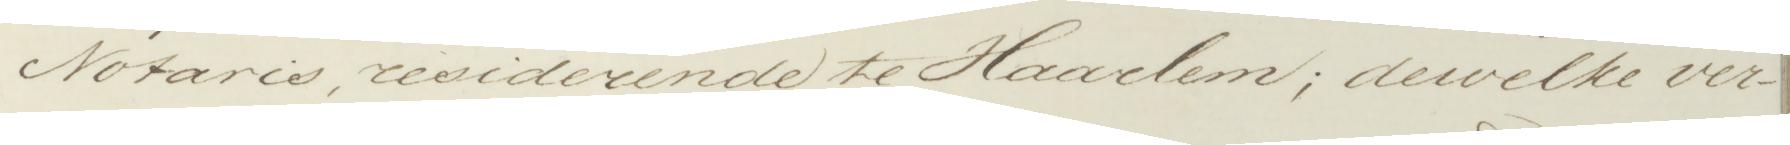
Notaris, residerende te Haarlem; dewelke ver-
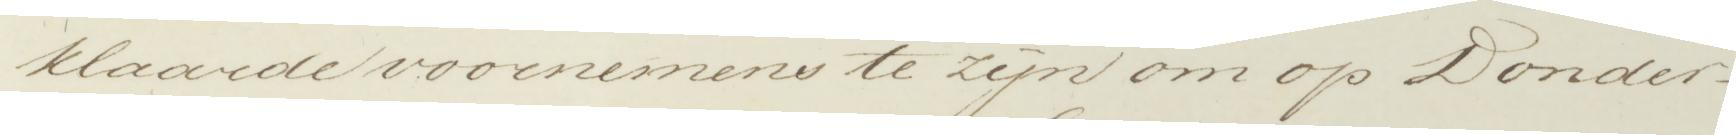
klaarde voornemens te zijn om op Donder-
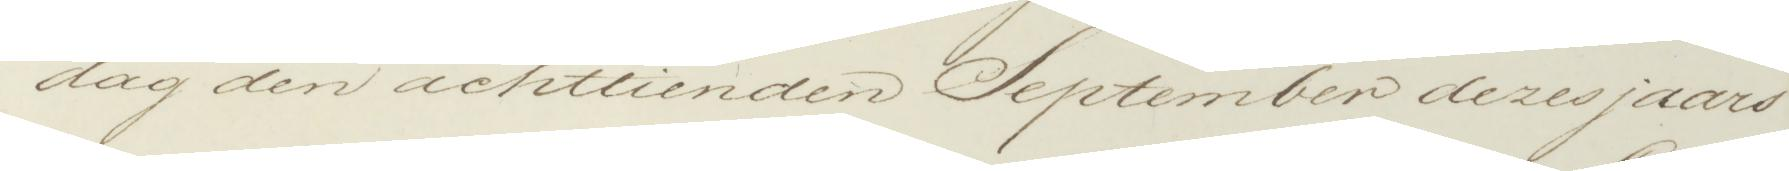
dag den achttienden September dezes jaars
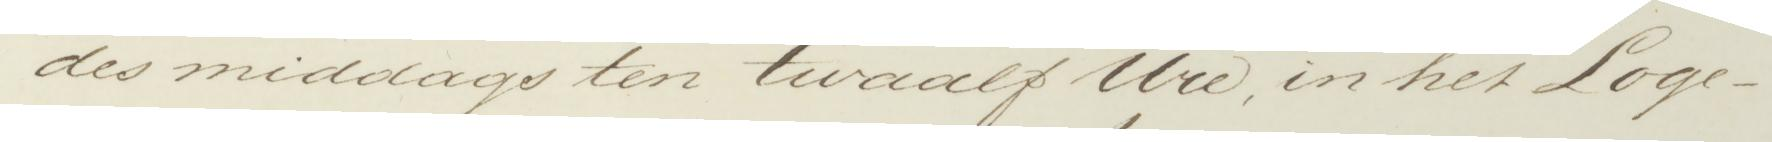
des middags ten twaalf Ure, in het Loge-
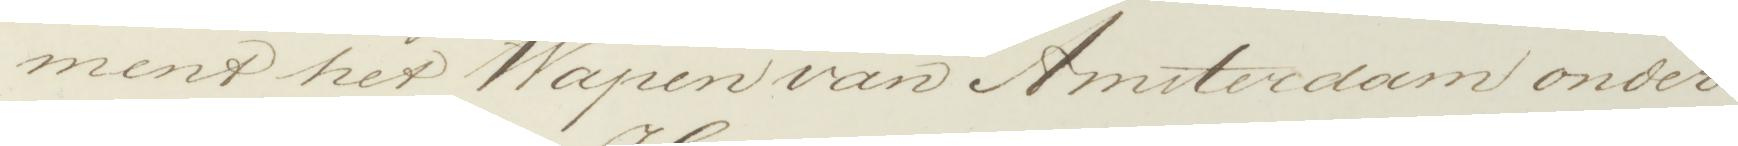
ment het Wapen van Amsterdam onder
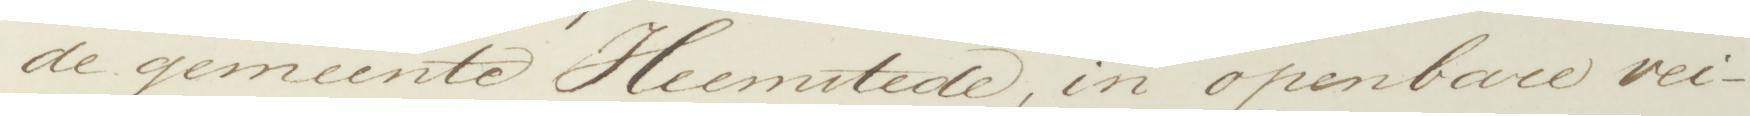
de gemeente Heemstede, in openbare vei-
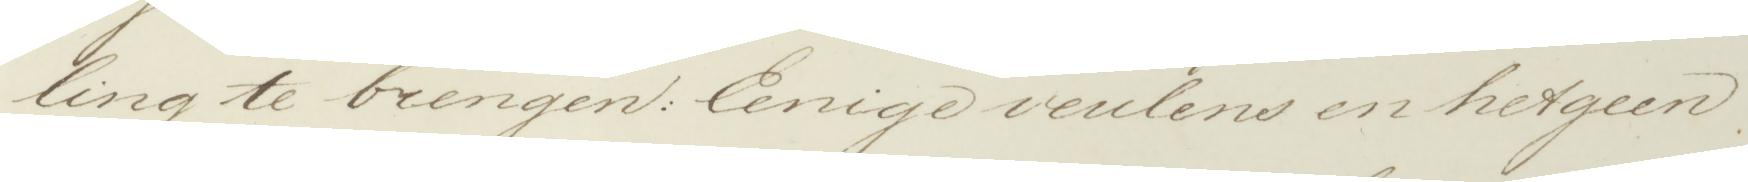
ling te brengen: Eenige veulens en hetgeen
